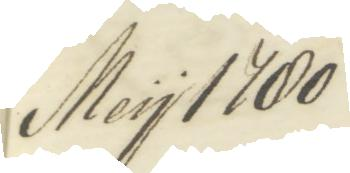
Meij 1780
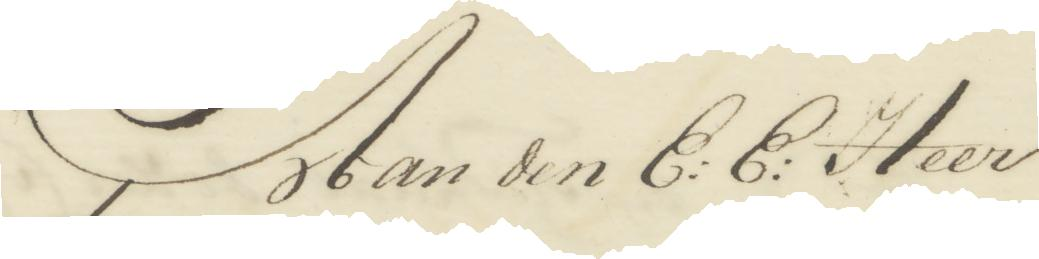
Aan den E: E: Heer
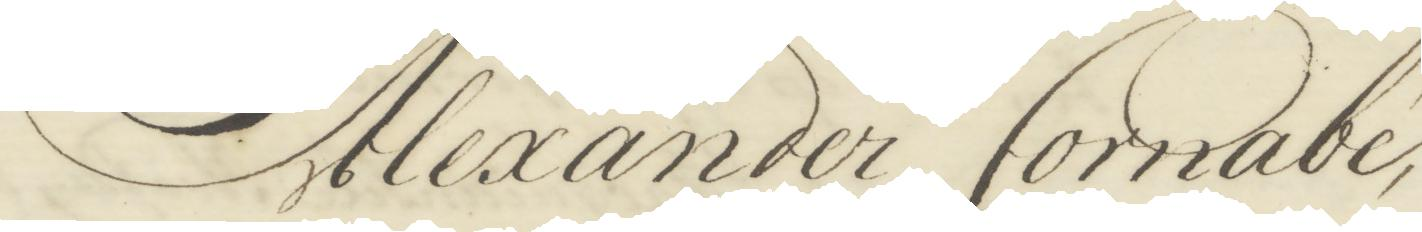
Alexander Cornabe,
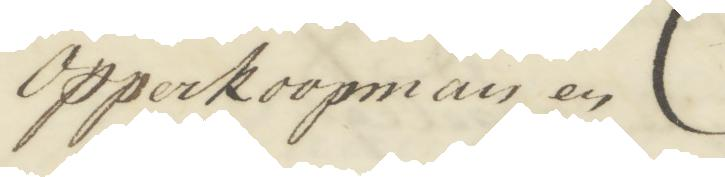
opperkoopman en
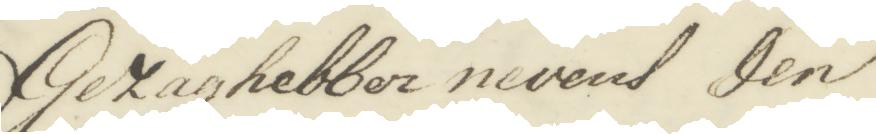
Gezaghebber nevens den
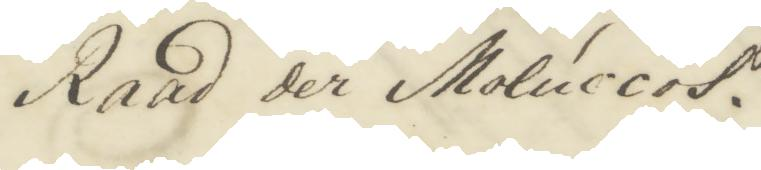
Raad der Moluccos.
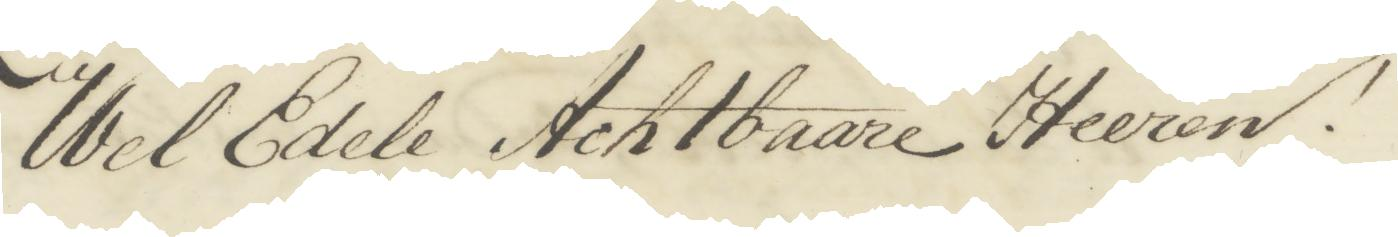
Wel Edele Achtbaare Heeren !
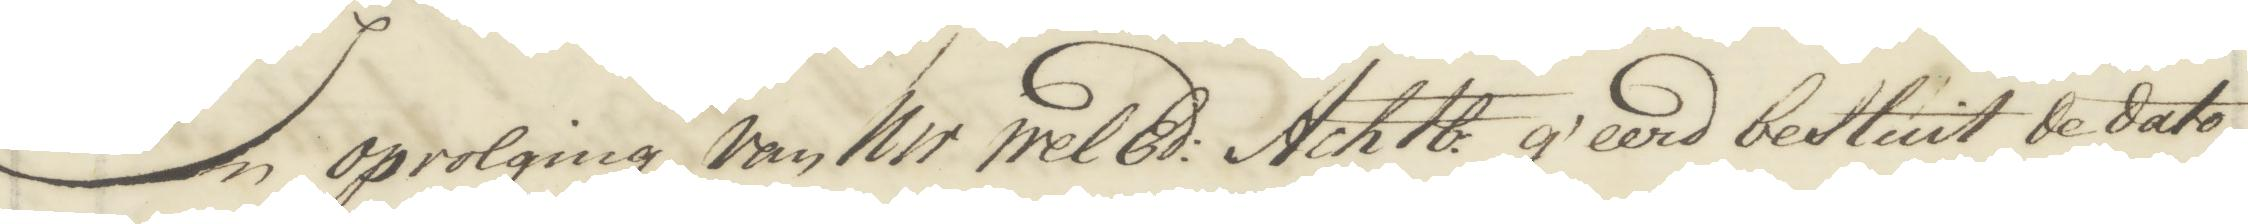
In opvolging van Uw wel Ed: Achtb: g’eerd besluit de dato
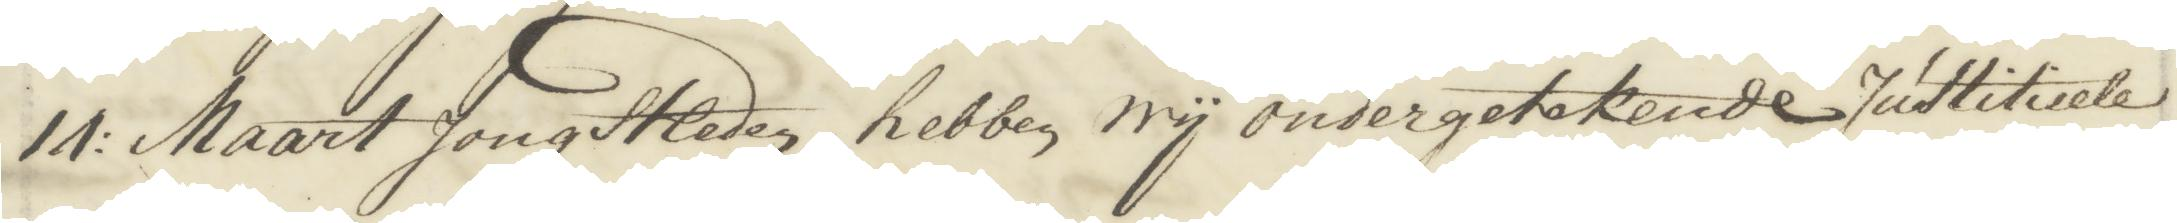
14: Maart jongstleden, hebben wij ondergetekende Justitieele
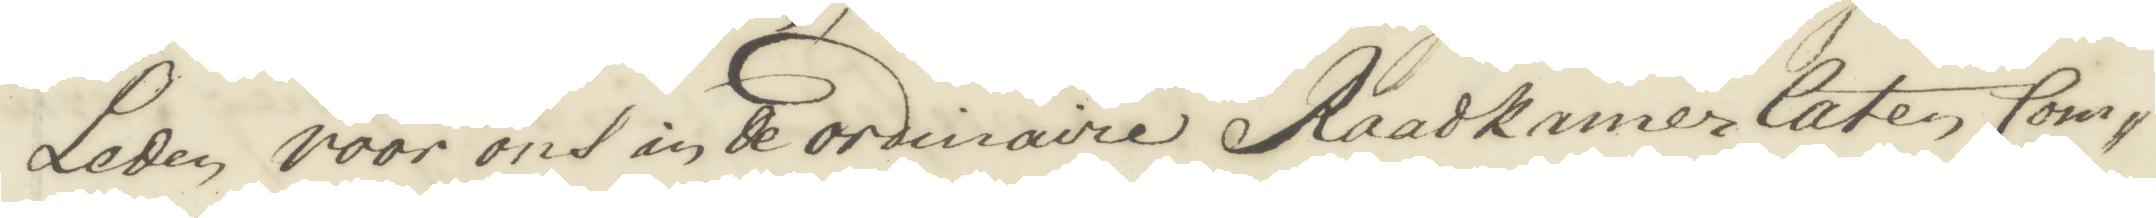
Leden voor ons in de ordinaire Raadkamer laten Com„
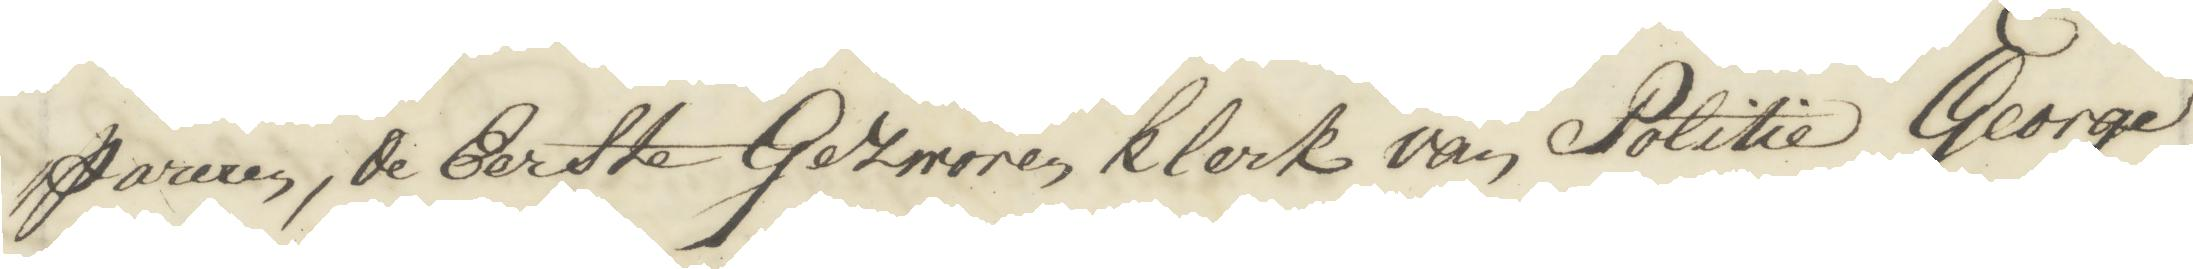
„pareren, de Eerste Gezworen klerk van Politie George
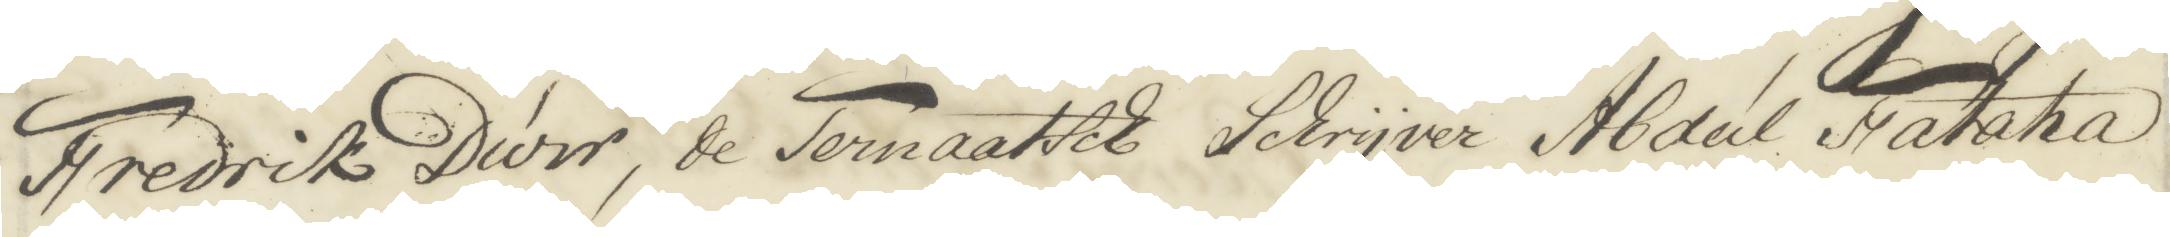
Fredrik Durr, de Ternaatsch Schrijver Abdul Fataha
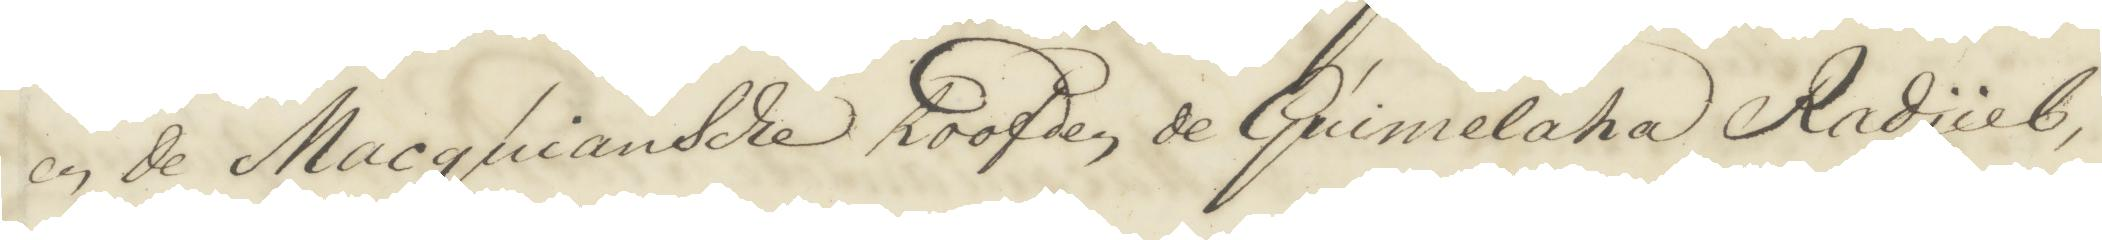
en de Macquiansche hoofden de Guimelaha Radjieb,
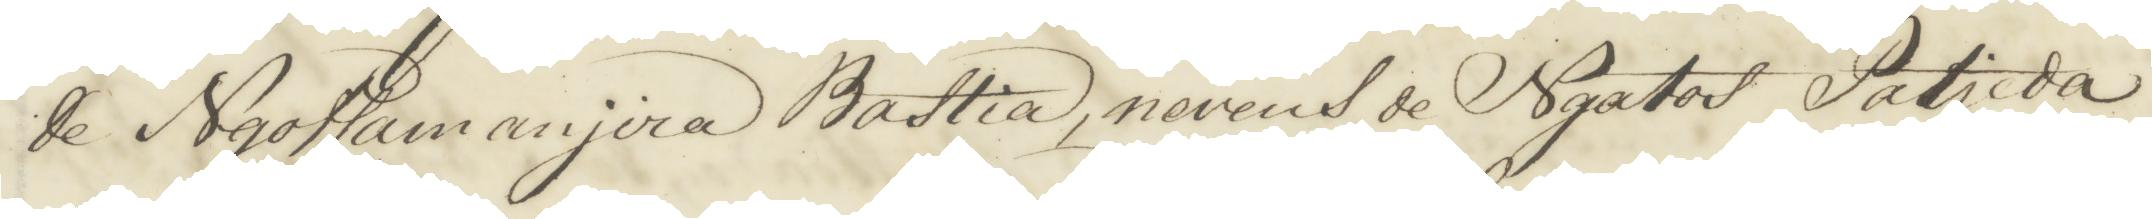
de Ngoflamanjira Bastia, nevens de Ngatos Patjeda
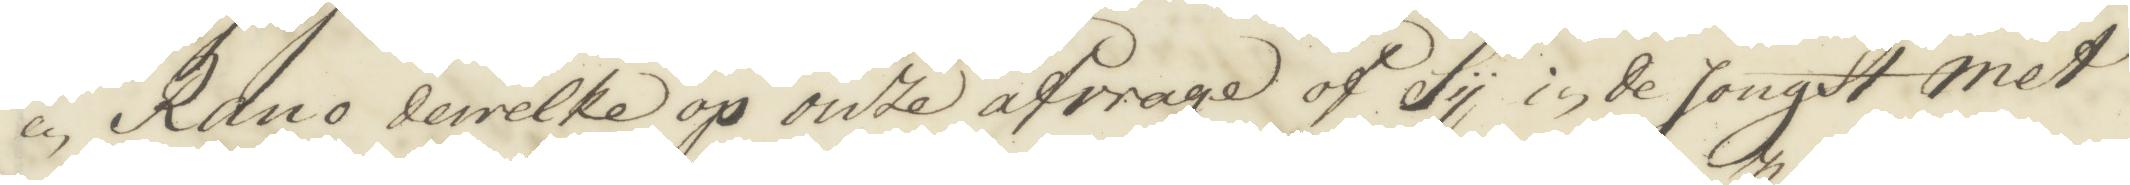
en Rano dewelke op onze afvrage of Sij in de jongst met
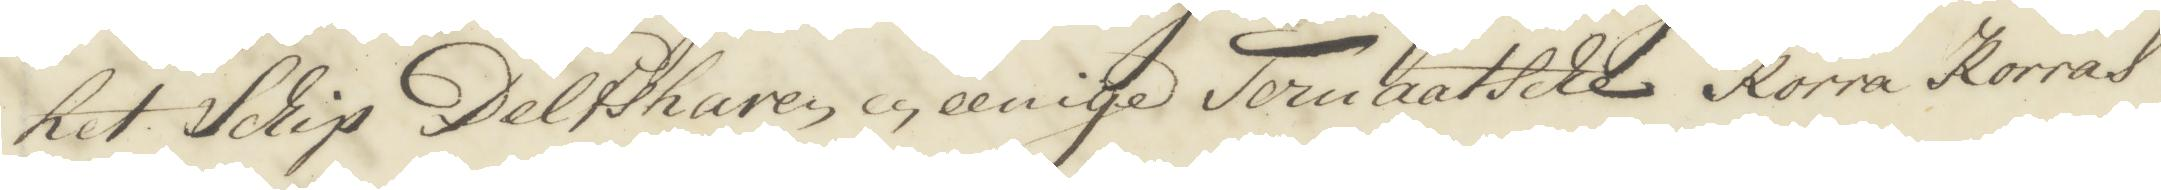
het schip Delfshaven en eenige Ternaatsche korra korras
